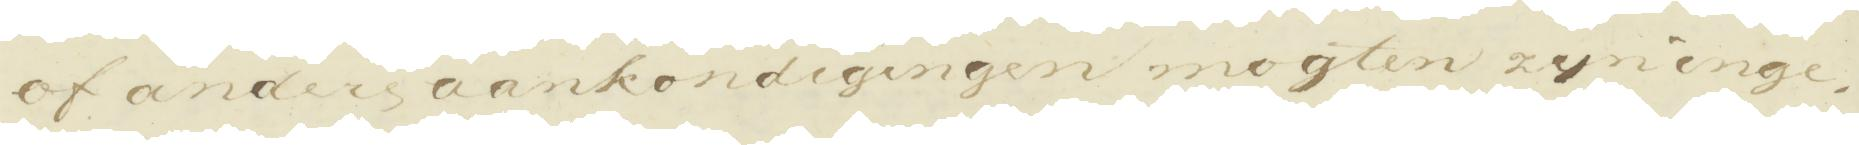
of andere aankondigingen mogten zijn inge,
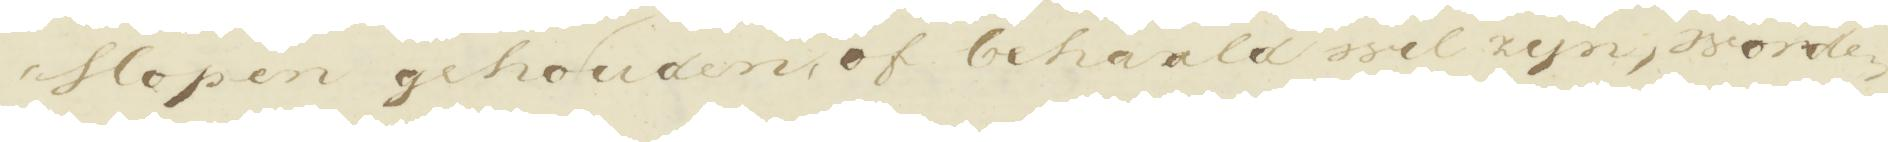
„slopen gehouden, of behaald wel zijn, worden
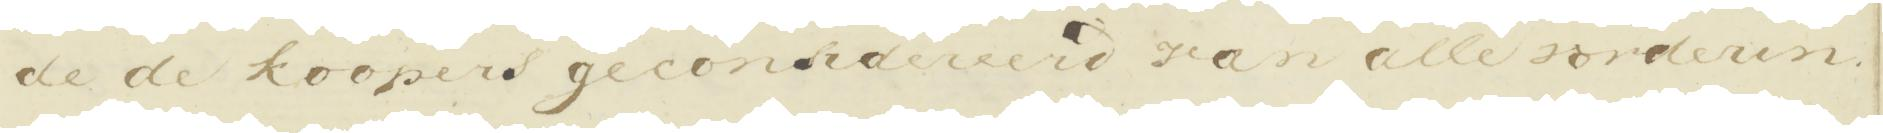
de de koopers geconsidereerd van alle vorderin.
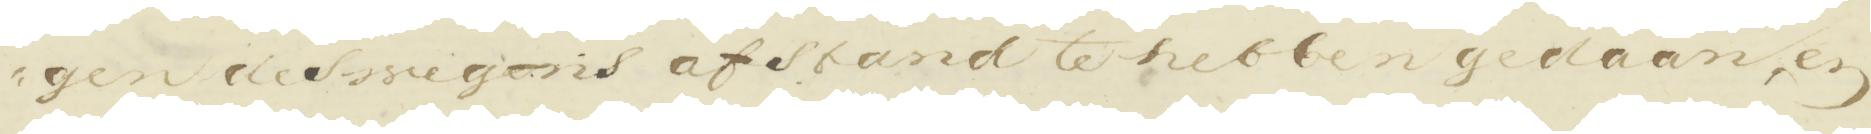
„gen deswegens afstand te hebben gedaan, en
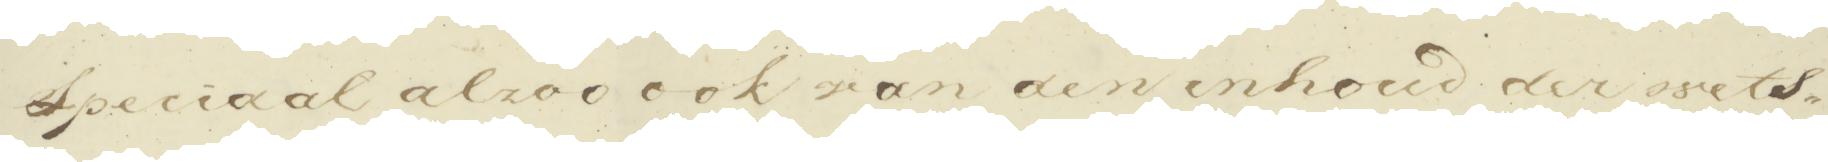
Speciaal alzoo ook van den inhoud der wets„
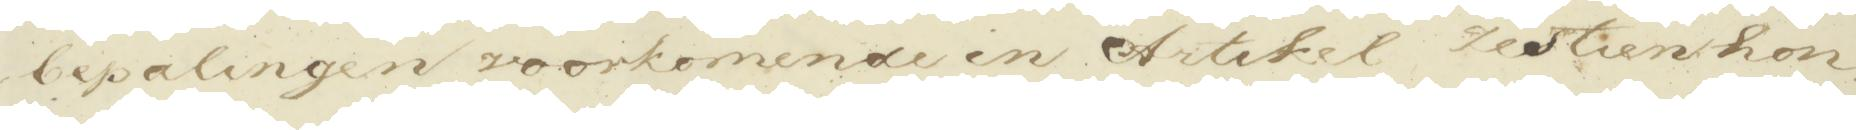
„ bepalingen voorkomende in Artikel zestien hon
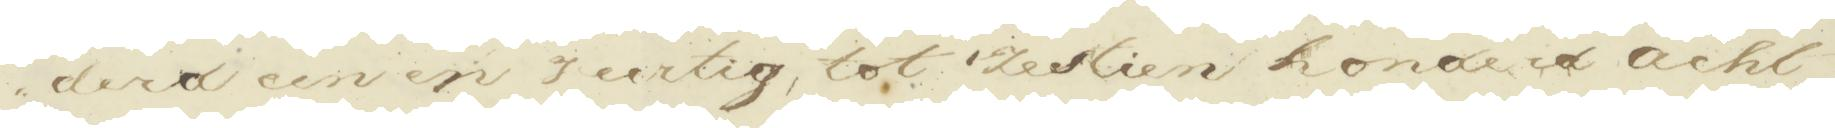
„ derd een en veertig, tot zestien honderd acht
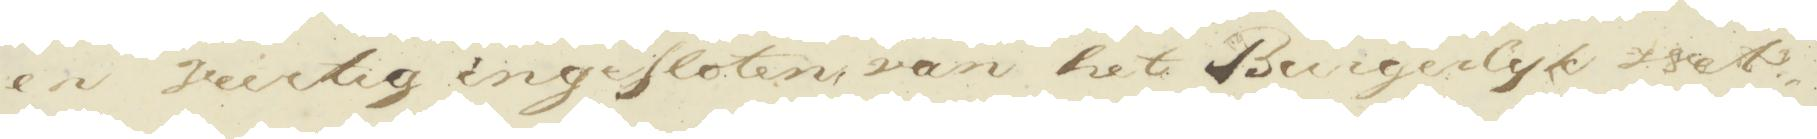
en veertig ingesloten, van het Burgerlyk wet„
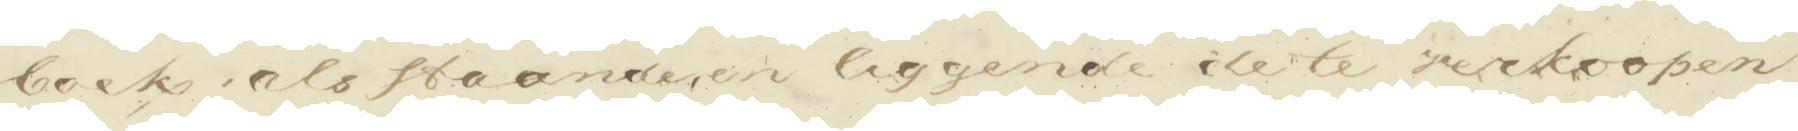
boek, als staande, en liggende de te verkoopen
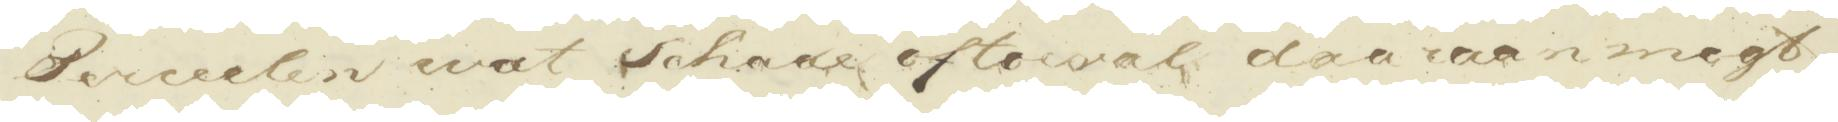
Perceelen wat schade of toeval daaraan mogt
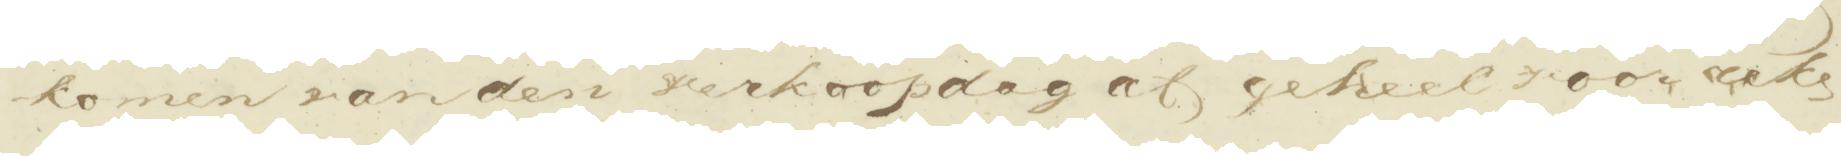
komen van den verkoopdag af geheel voor reke
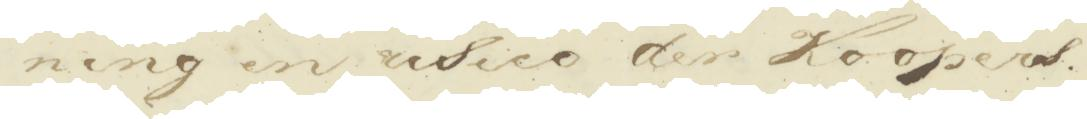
ning en risico der Koopers.
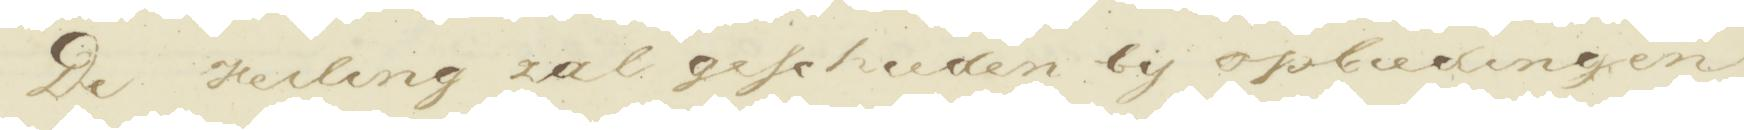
De Veiling zal geschieden bij opbieding en
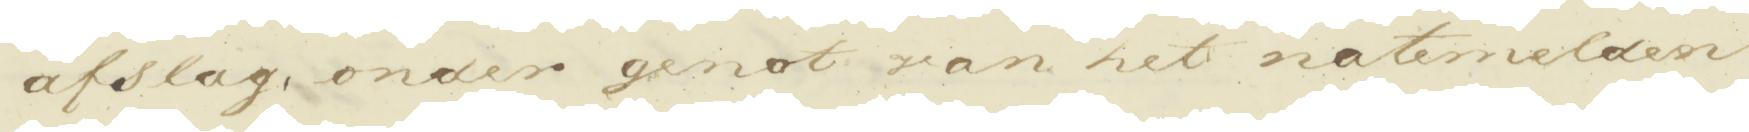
afslag, onder genot van het natemelden
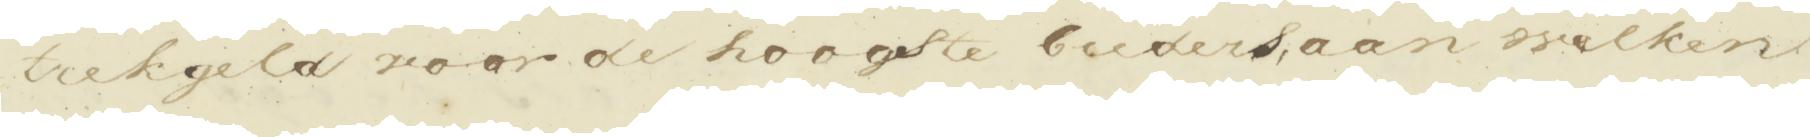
trekgeld voor de hoogste bieders, aan welken
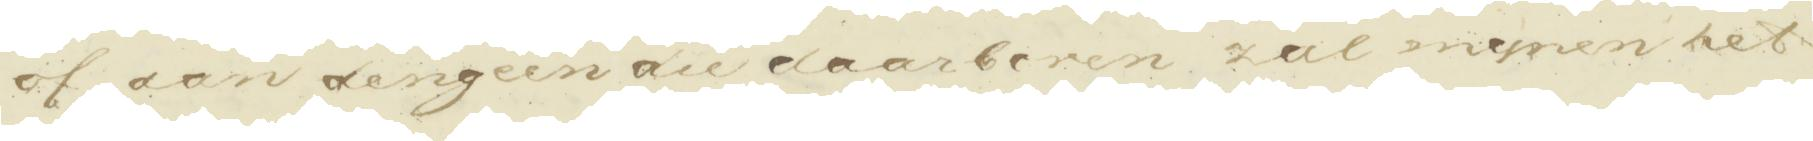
of aan dengeen die daarboven zal mynen het
